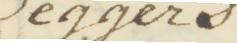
Leggers
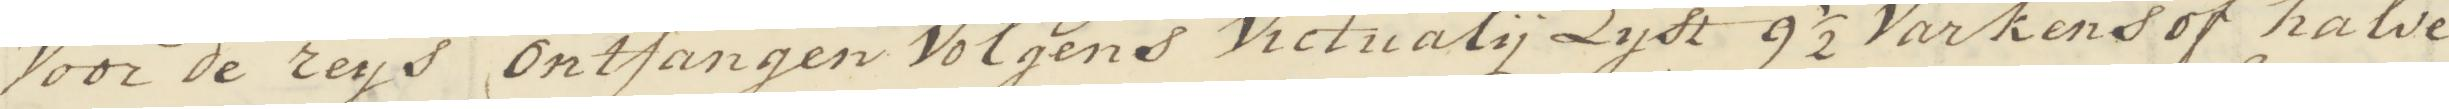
voor de reijs ontfangen volgens Victualij Lyst 9½ varkens of halve
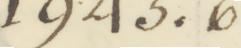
1945. 6
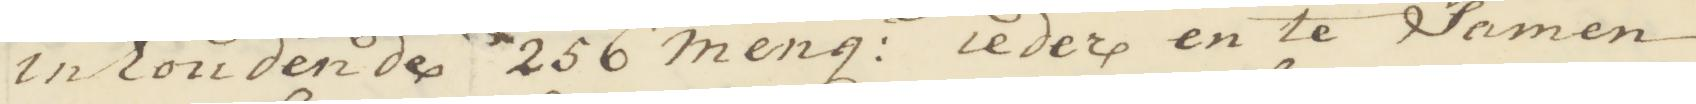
inhoudende 256 meng: ieder en te samen
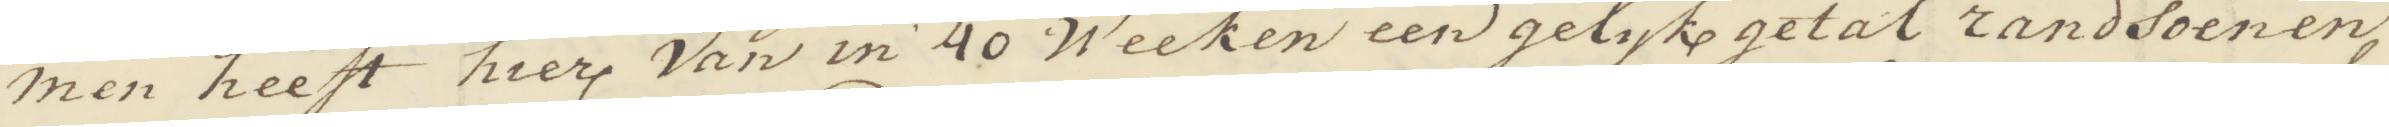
men heeft hier van in 40 weeken een gelyk getal randsoen en
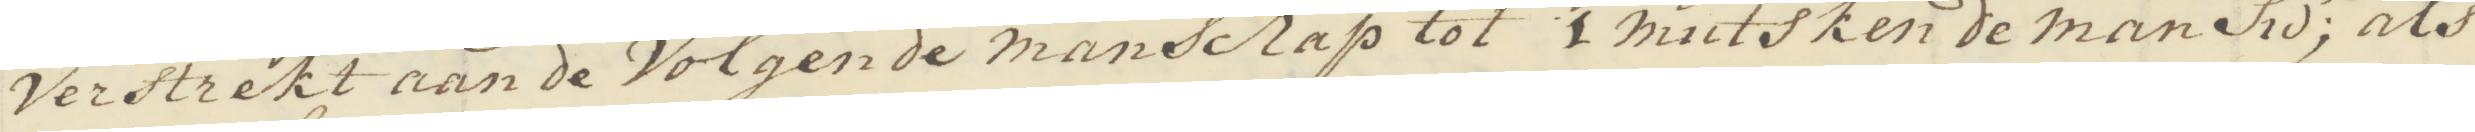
verstrekt aan de volgende manschap tot 1 mutsken de man sio;ks als
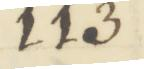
113 –
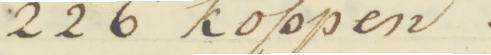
226 koppen
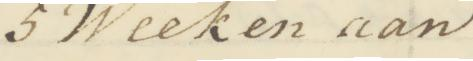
5 weeken aan
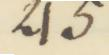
45 –
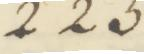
225
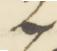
2
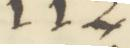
112 –
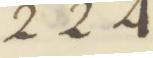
224
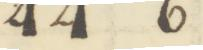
44 6
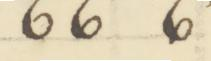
66 6
